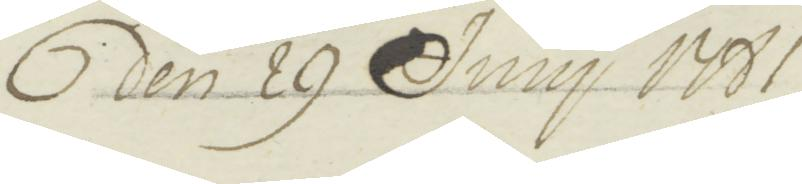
den 29 Junij 1781
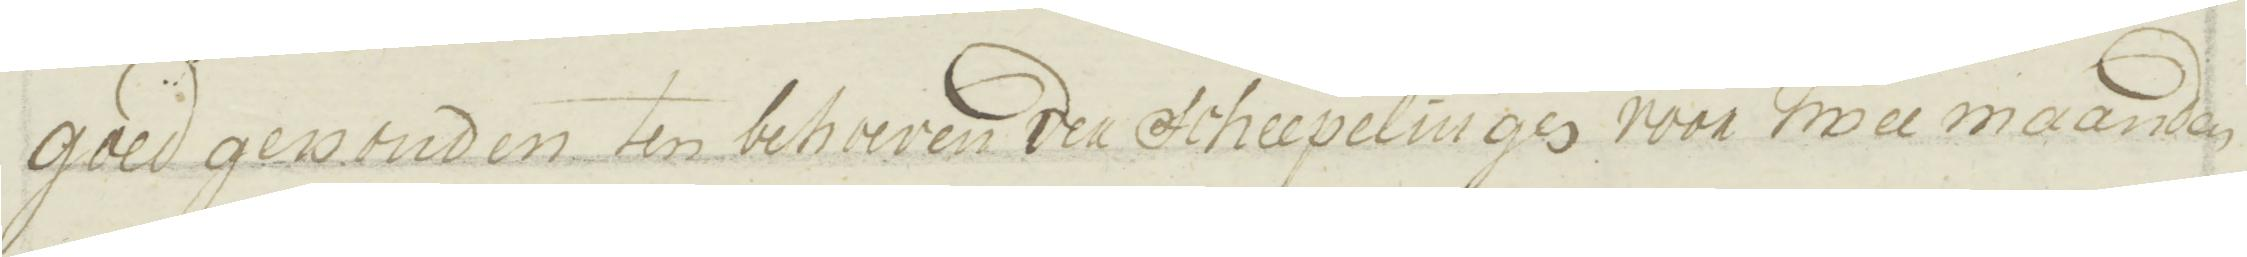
goed gevonden ten behoeven der scheepelingen voor twee maanden
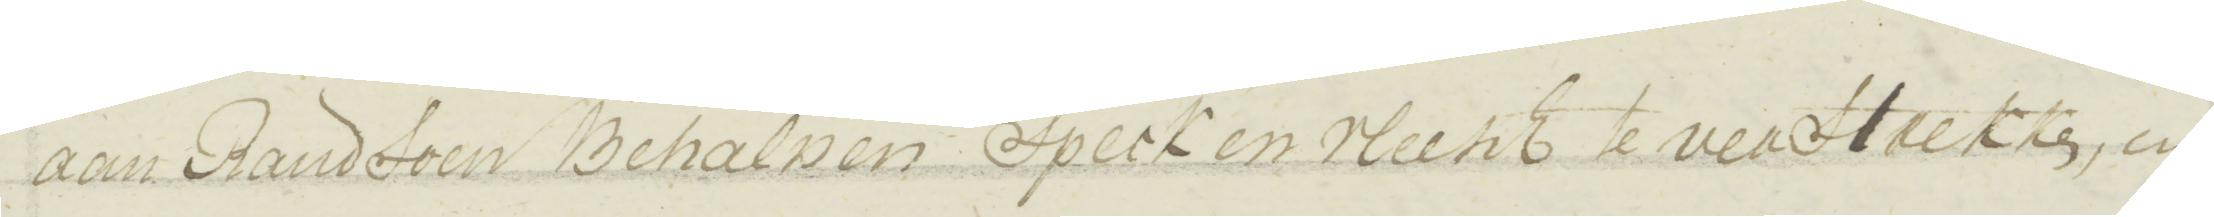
aan Randsoen Behalven speck en vleesch te verstrekken, en
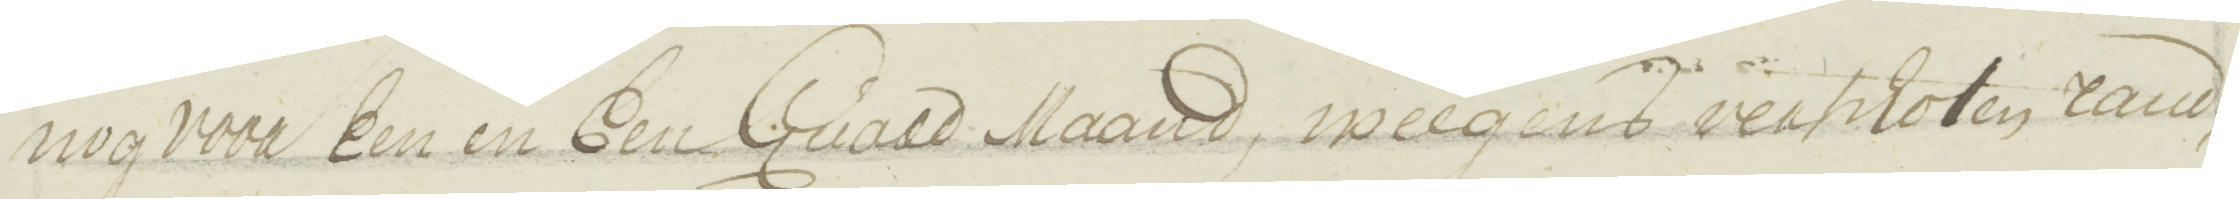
nog voor Een en Een Quard: Maand, weegens verschoten rand
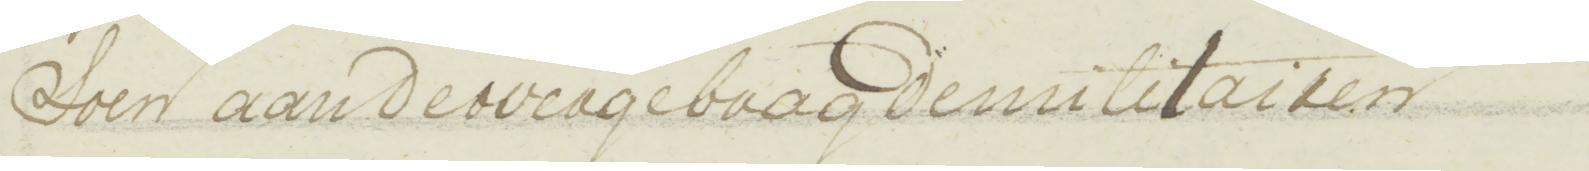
Soen aan de overgebragde militairen
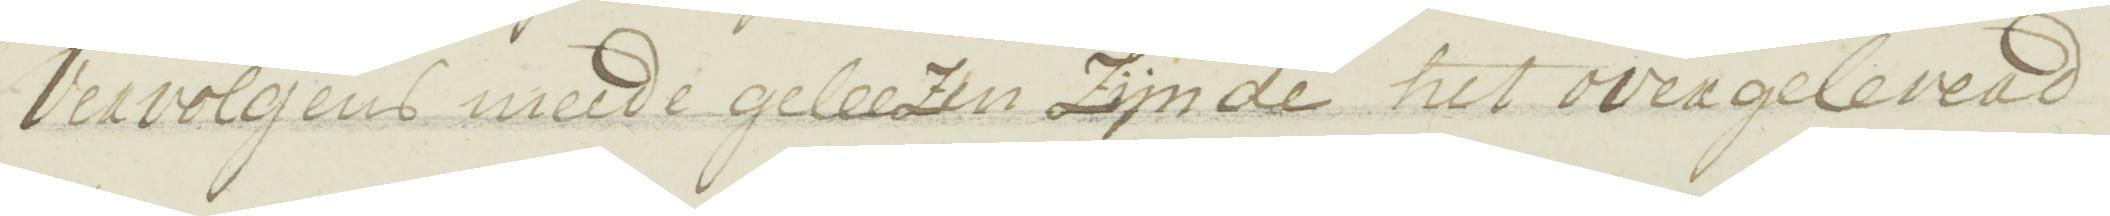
vervolgens meede geleezen zijnde het overgeleverd
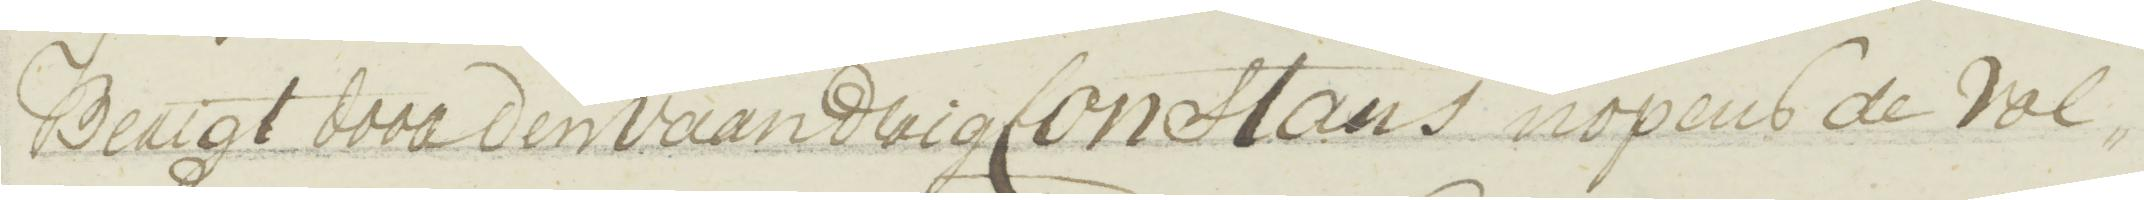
Berigt door den vaanderig Constans nopens de vol„
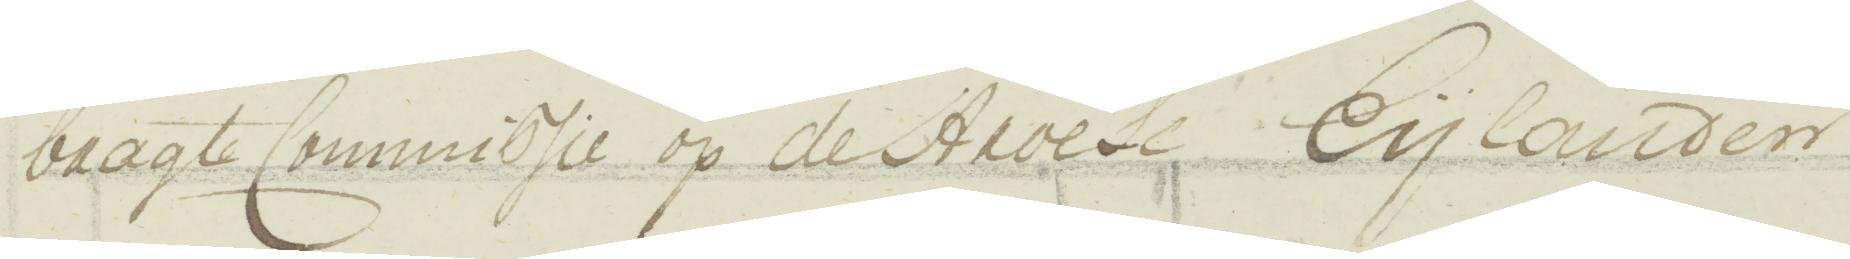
bragte Commissie op de Aroese Eijlanden
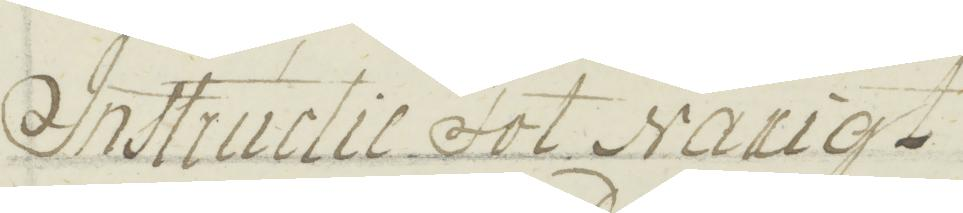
Instructie Tot narigt
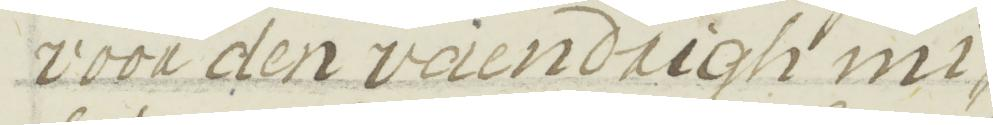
voor den vaendrigh mi„
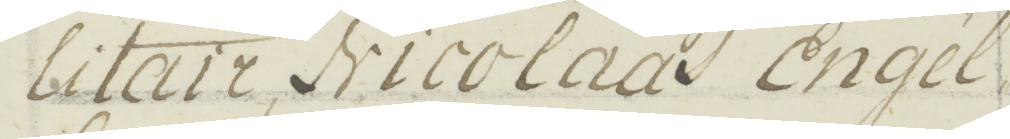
litair, Nicolaas Engel
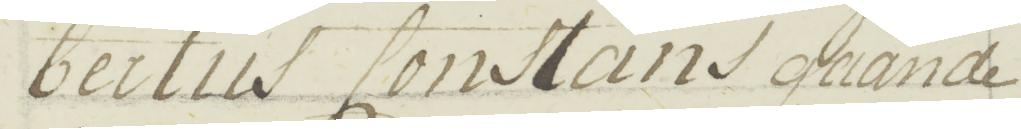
bertus Constans gaande
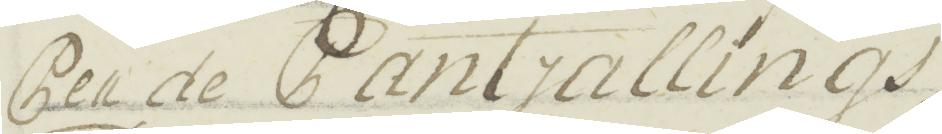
Per de Pantjallings
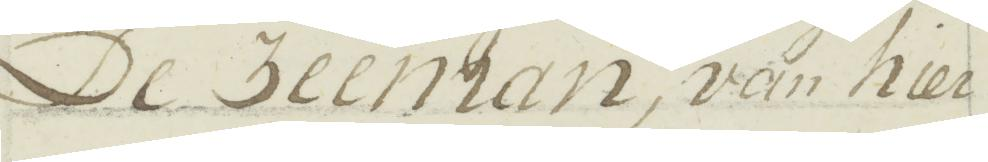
De Zeeman, van hier
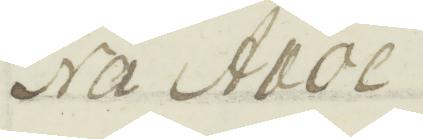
na Aroe
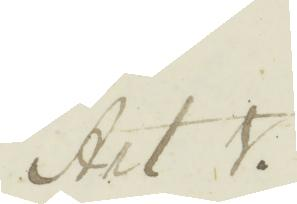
Art 1.
